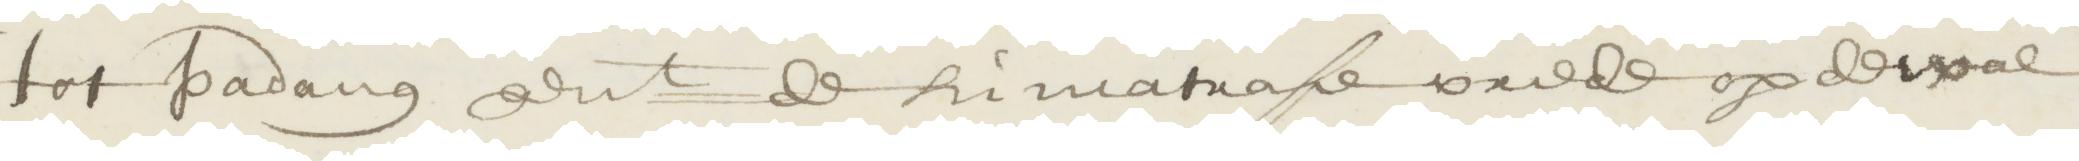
tot padang gen=t de sumatrase vrede op de wal
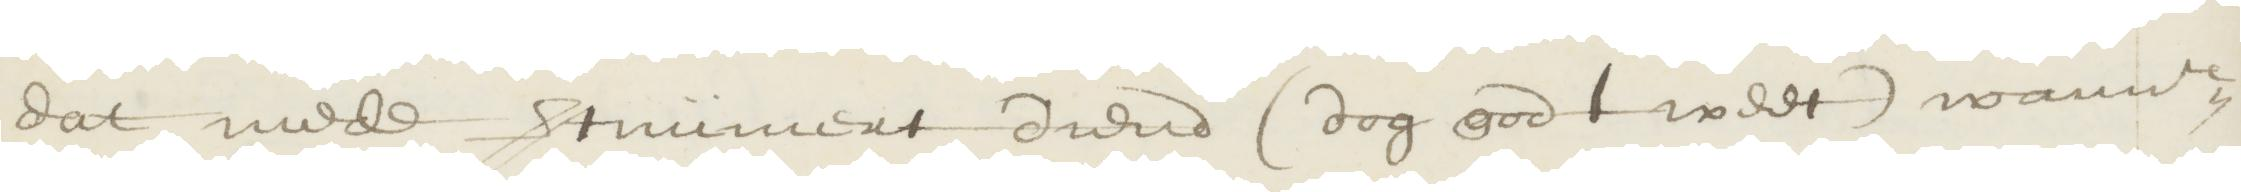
dat mede vertimmert diend (dog godt weet) wannr„
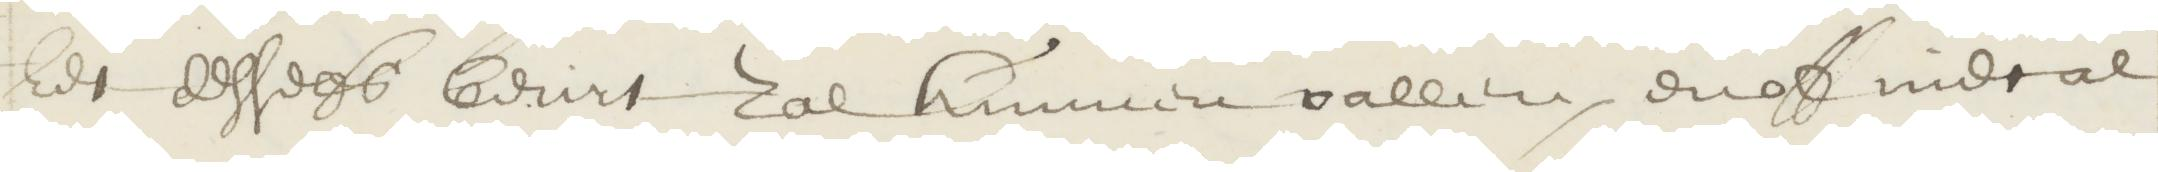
het desselfs beurt Zal kunnen vallen, en off niet al
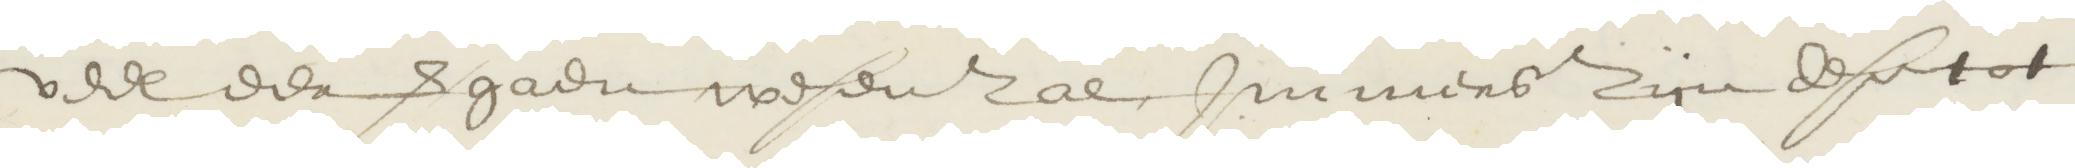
veel eer vergaen wesen Zal, jmmers zijn dese tot
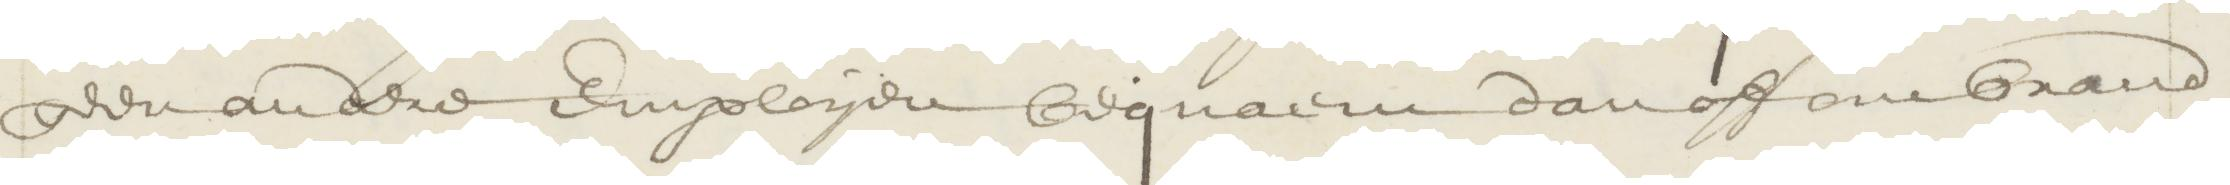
een andere Emploijen bequaem dan off om brand
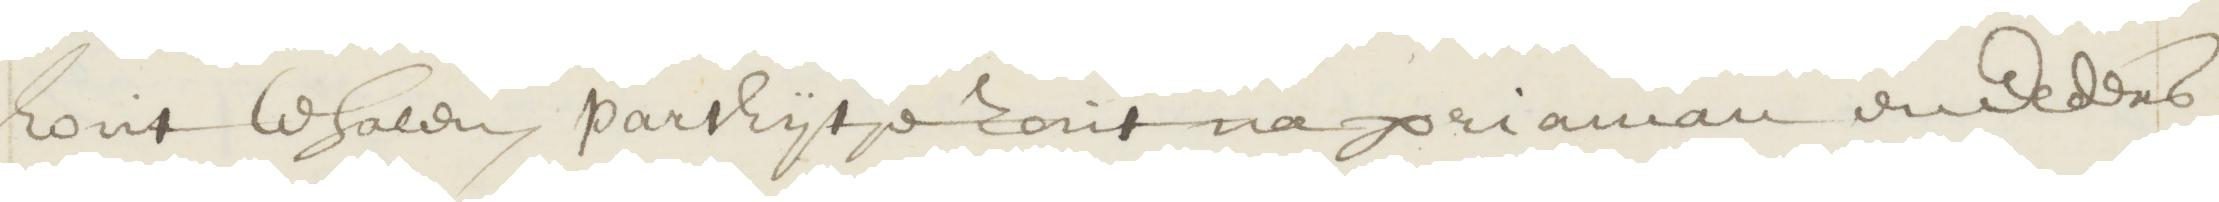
hout tehalen, parthijtje zout na priaman en Elders
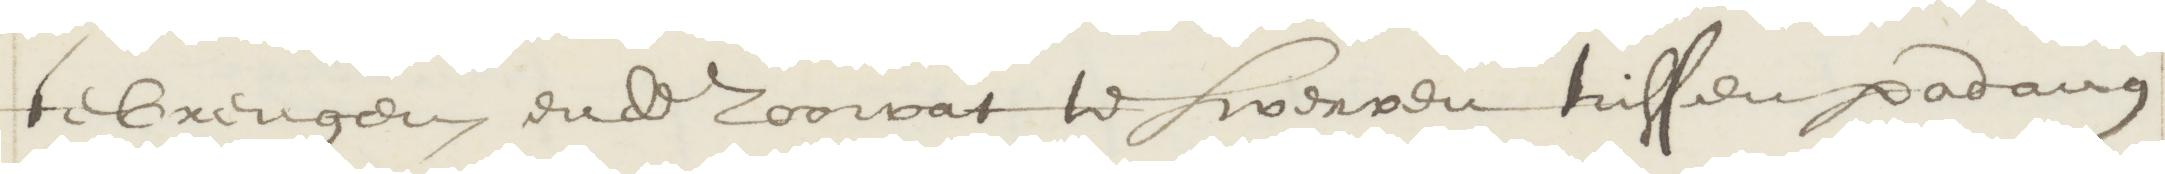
tebrengen, ende Zoowat te swerven tussen padang
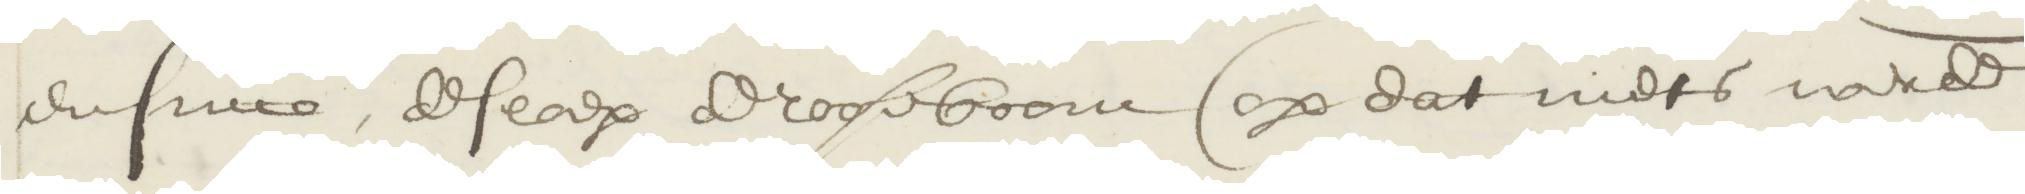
en sinco, de sloep de rooseboom (op dat niets werde
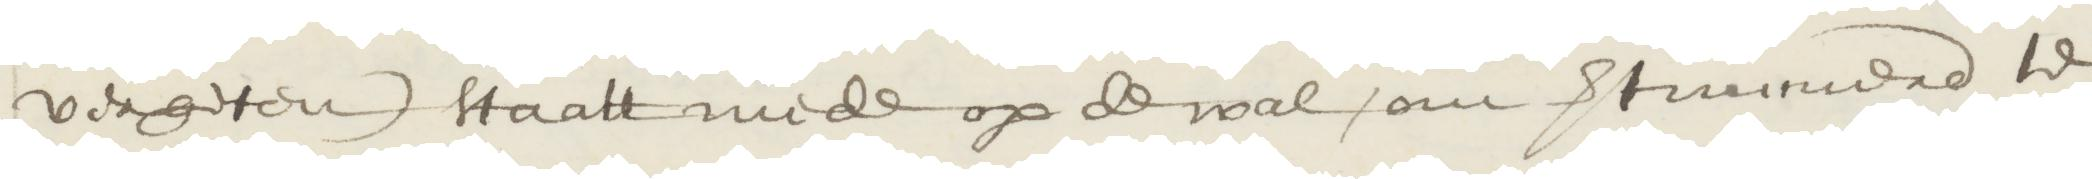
vergeten) staatt mede op de wal, om vertimmerd te
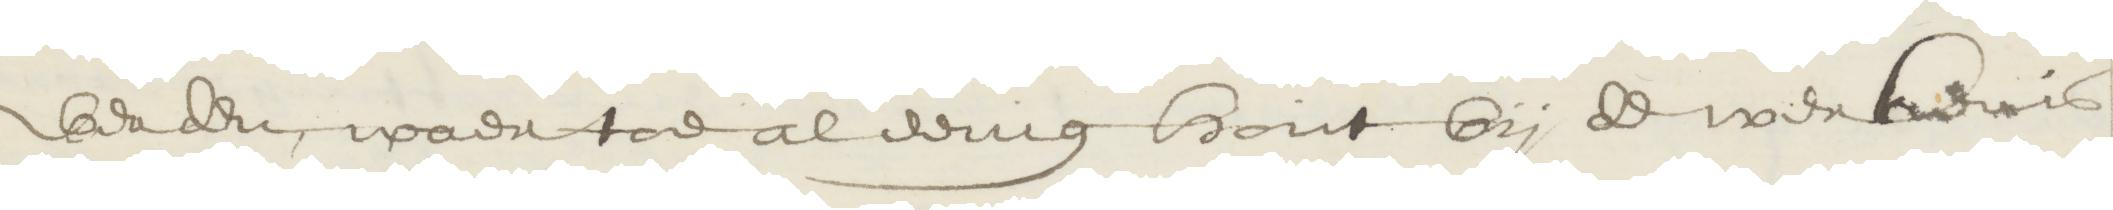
werden, waer toe al eenig hout bij de werker is
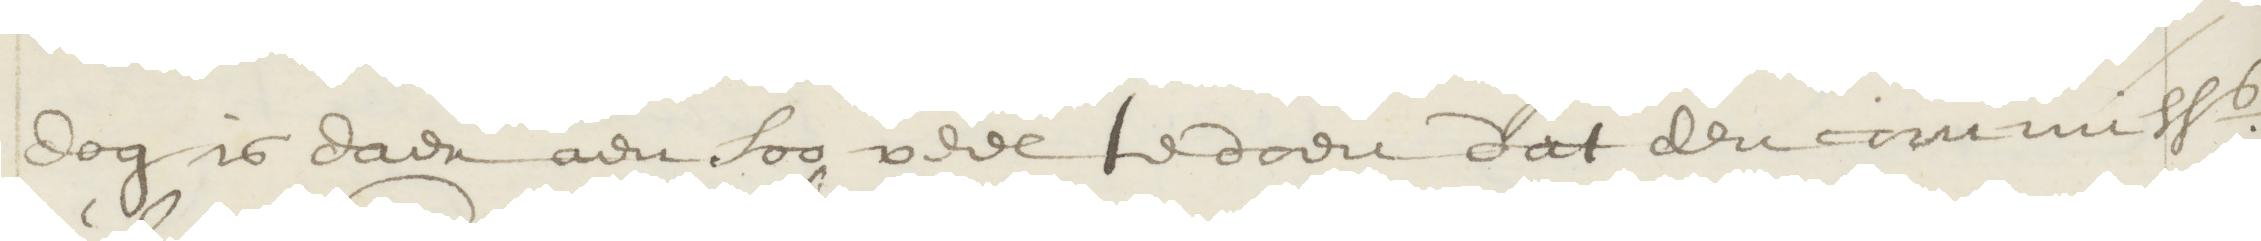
dog is daer aen soo veel te doen dat den commiss.s
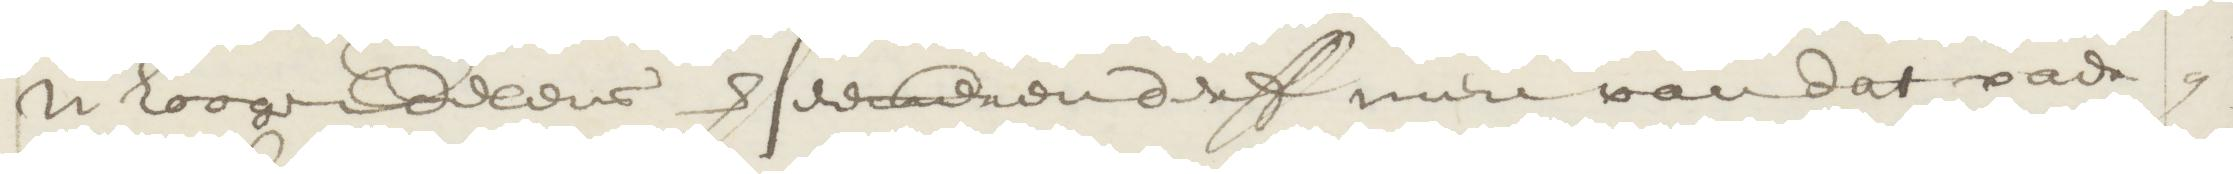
u hooge Edelens verseeckeren derff men van dat vaer„
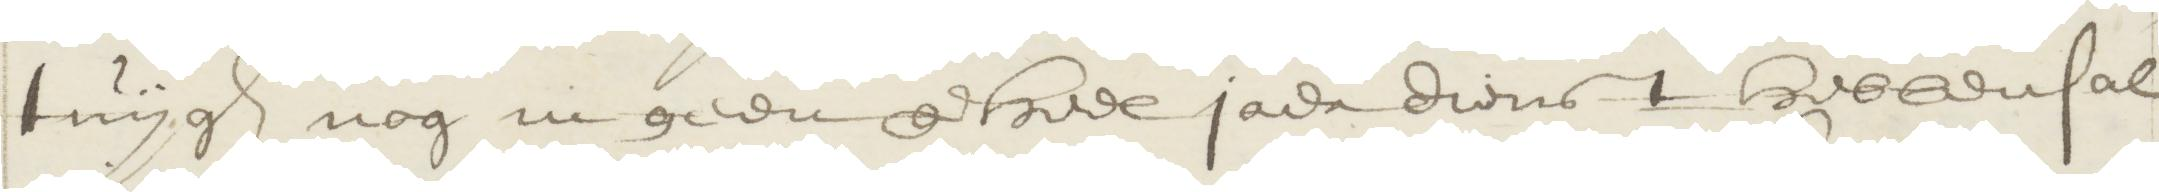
tuijgh nog in geen geheel jaer dienst hebben sal
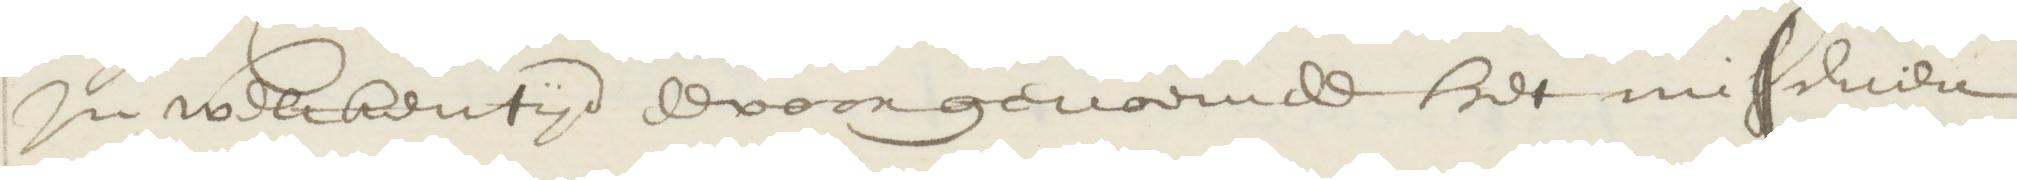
In welcken tijd de voor genoemde het misschien
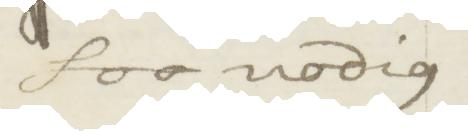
soo nodig
